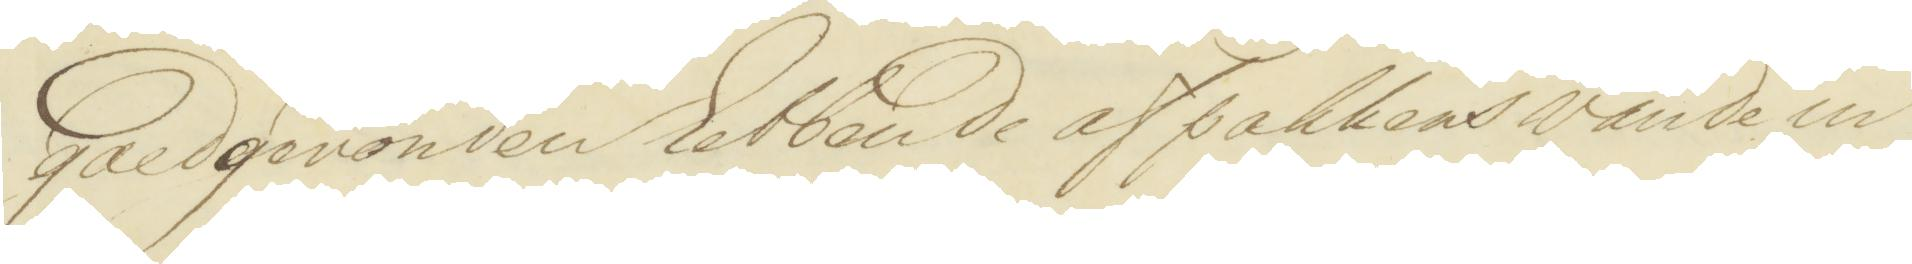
goedgevonden hebben de afpakkers vande in
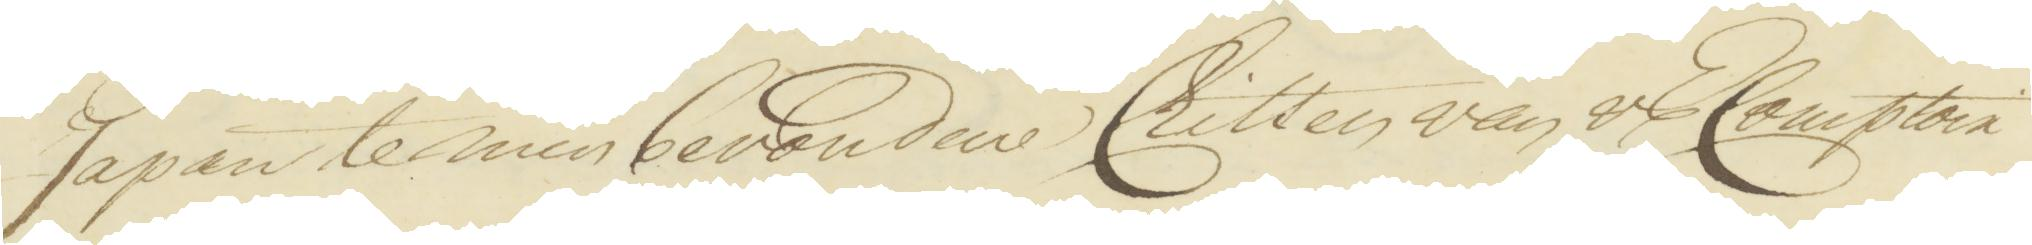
Japan te min bevondene Chitsen van vE Comptoir
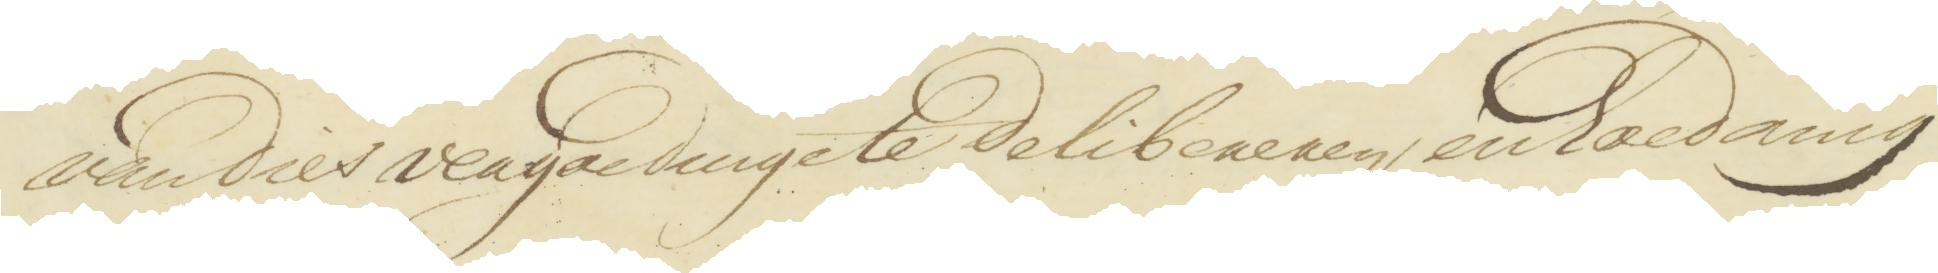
van dies vergoedinge te delibereren, en hoedanig
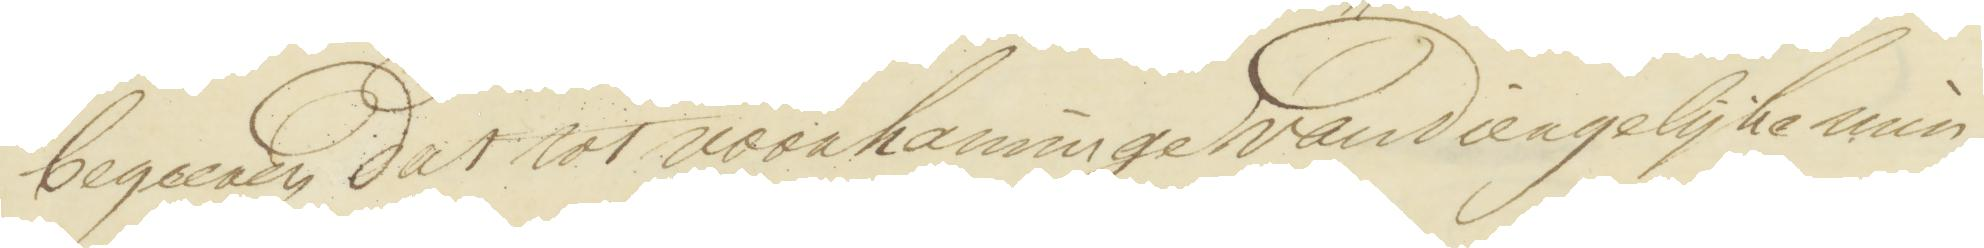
begeeren dat tot voorkominge van diergelijke min
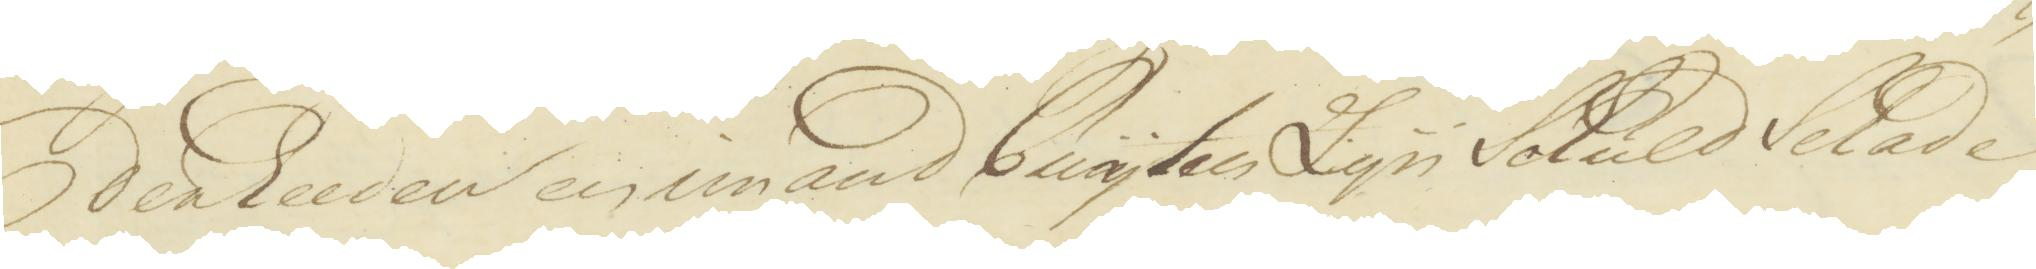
derheeden en imand buijten zijn schuld schade
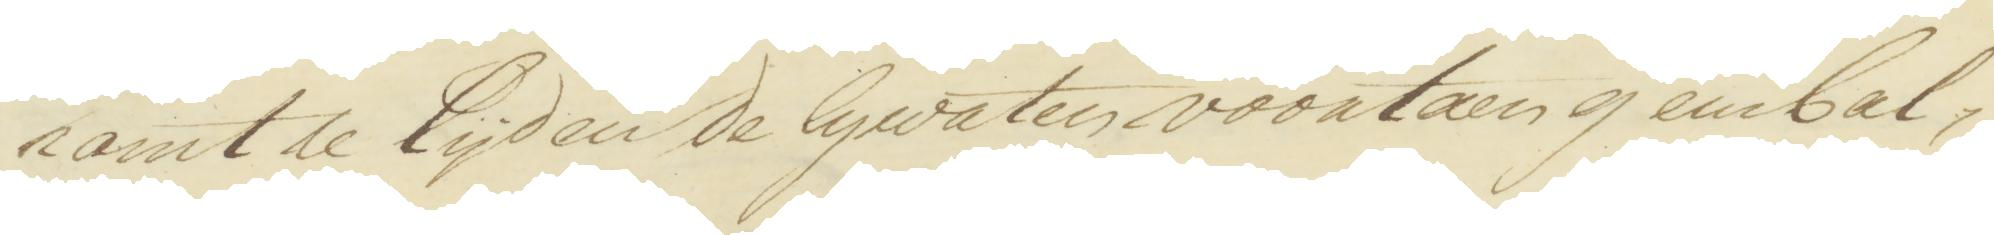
komt te lijden de lywaten voortaen g'embal„
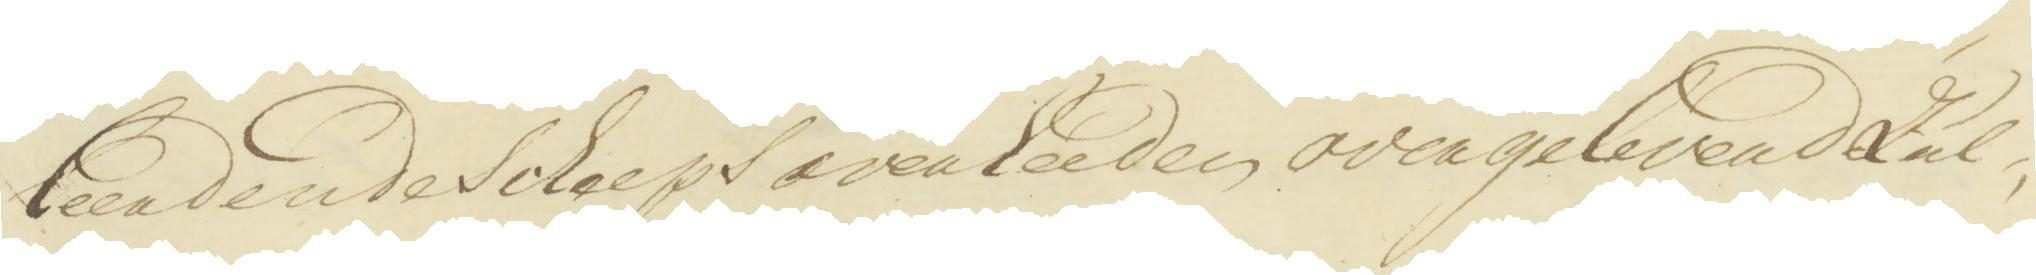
leerd ende scheepsoverheeden overgeleverd zul„
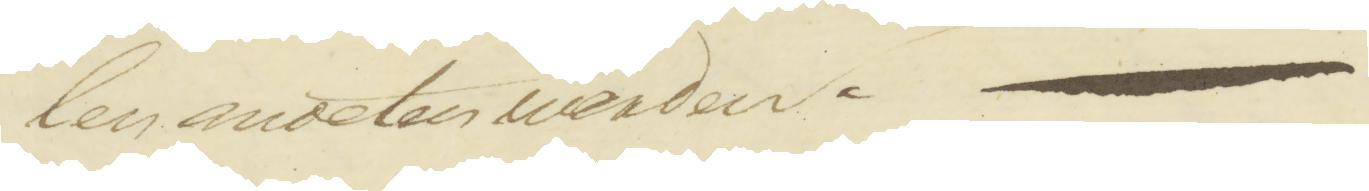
len moeten werden. —
